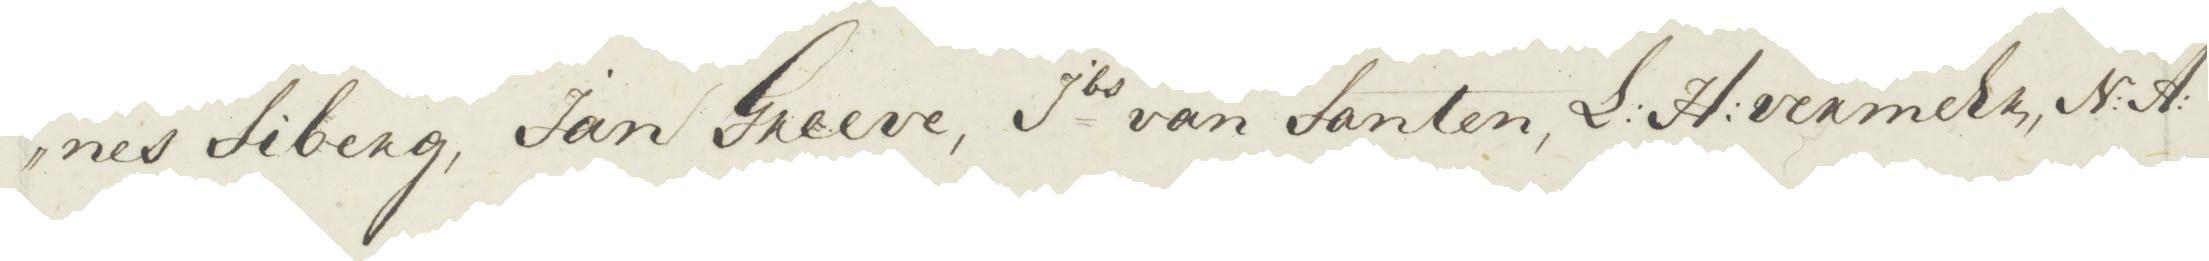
„nes Siberg, Ian Greeve, I=bs van Santen, L: H: vermehr, N: A:
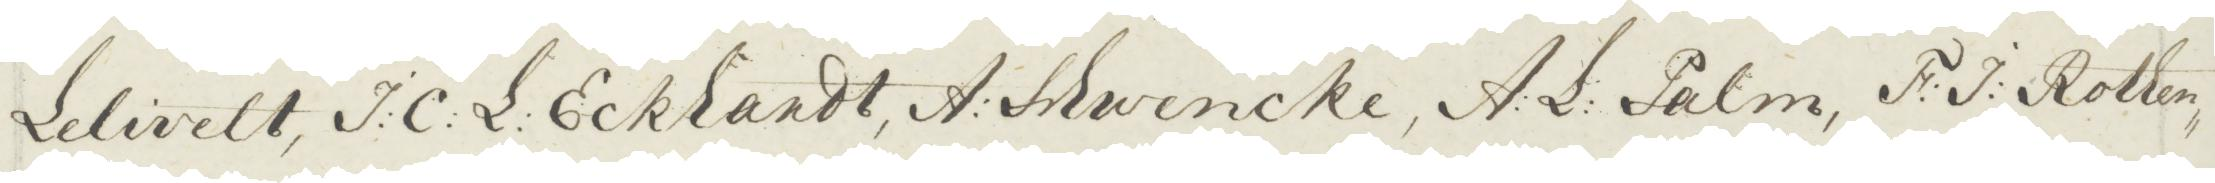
Lelivelt, I: C: L: Eckhardt, A: Schwencke, A: L: Palm, F: J: Rothen„
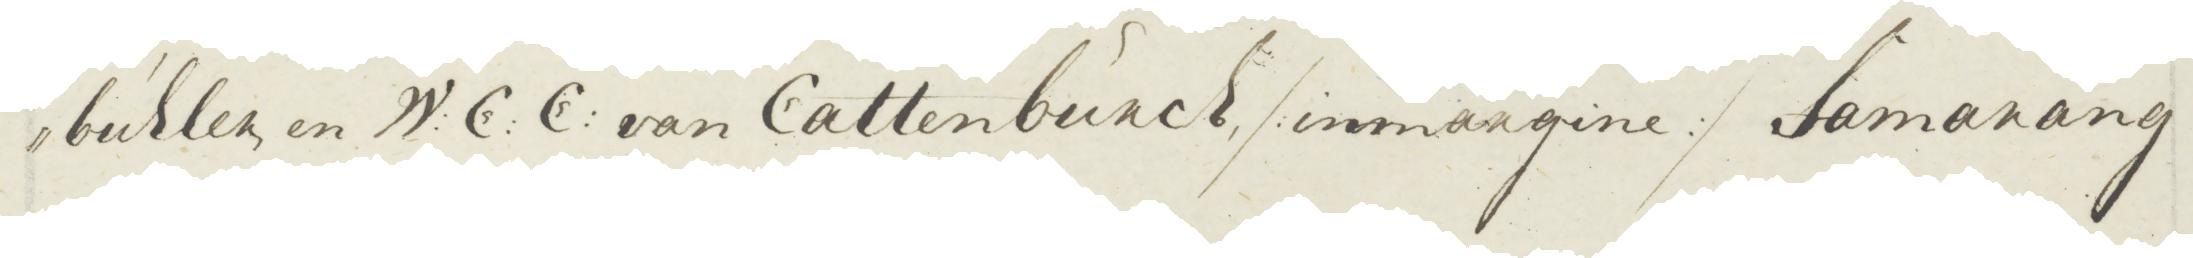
„buhler en W: C: C: van Cattenburch, /:inmargine:/ Samarang
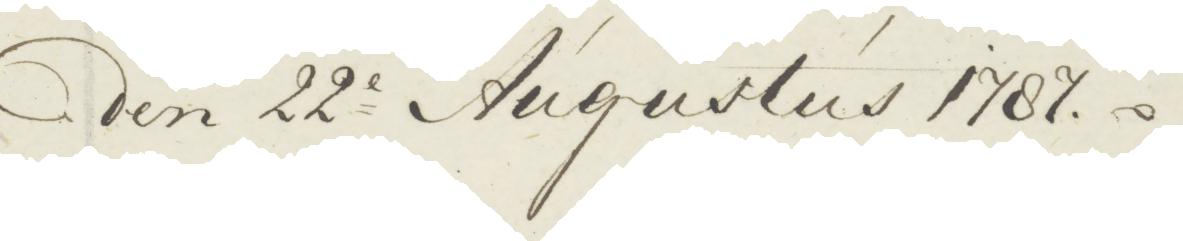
den 22=e Augustus 1787. —
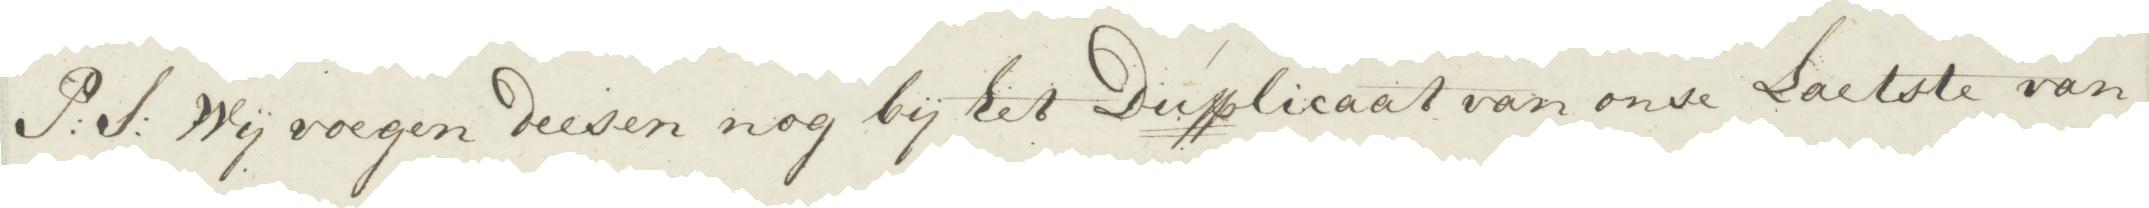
P: S: Wij voegen deesen nog bij het Dupplicaat van onse Laetste van
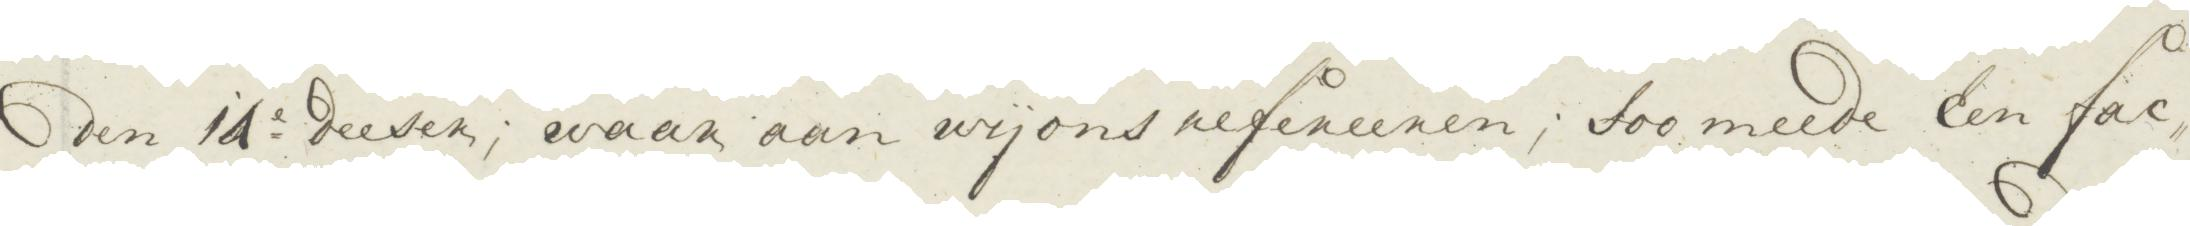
den 14=e deeser; waar aan wij ons refereeren; soo meede Een fac
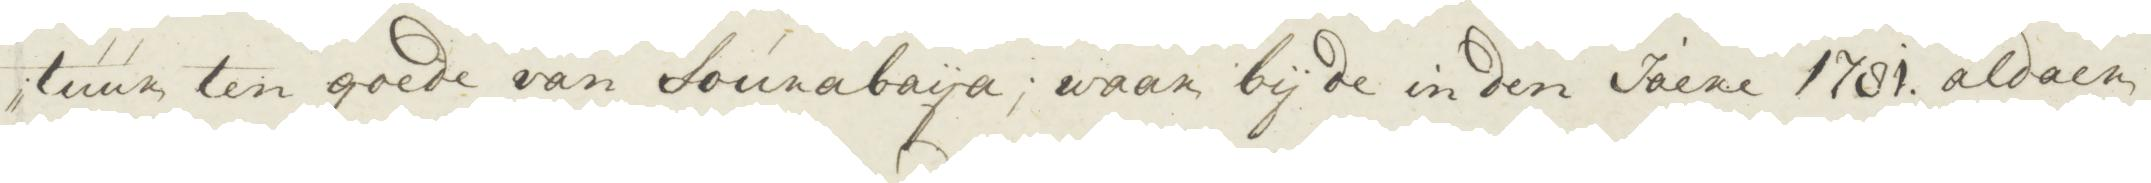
„tuur ten goede van sourabaija; waar bij de in den Iaere 1781. aldaer
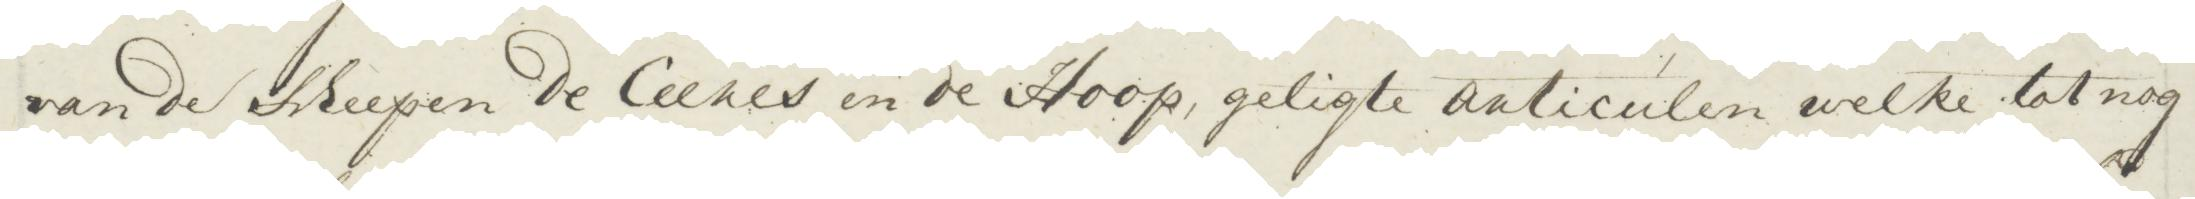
van de scheepen de Ceeres en de Hoop, geligte articulen welke tot nog
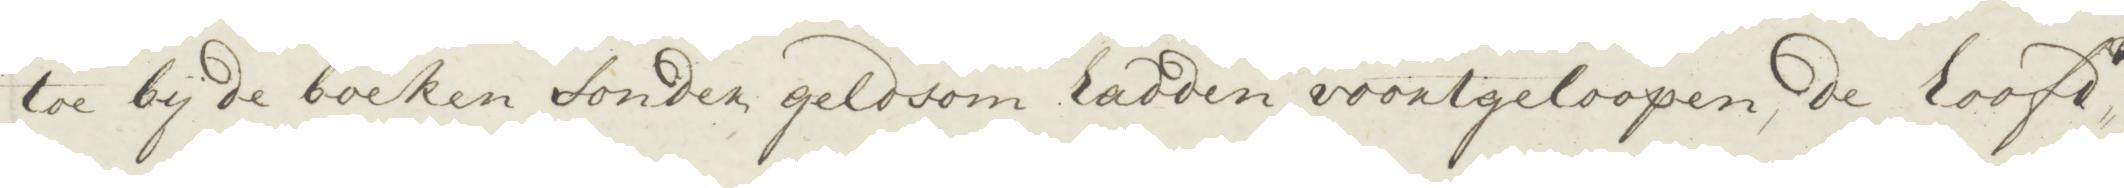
toe bij de boeken sonder geldsom hadden voortgeloopen, de hoofd„
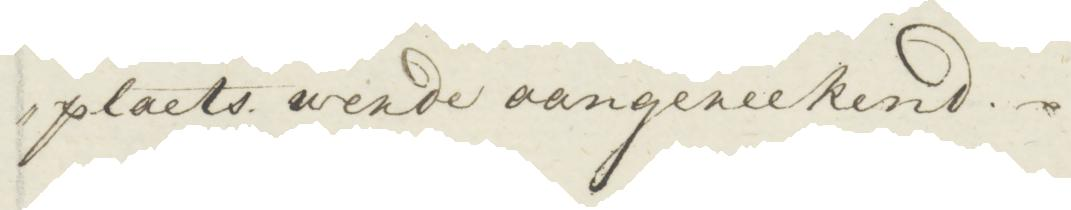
„plaets. werde aangereekend. —
